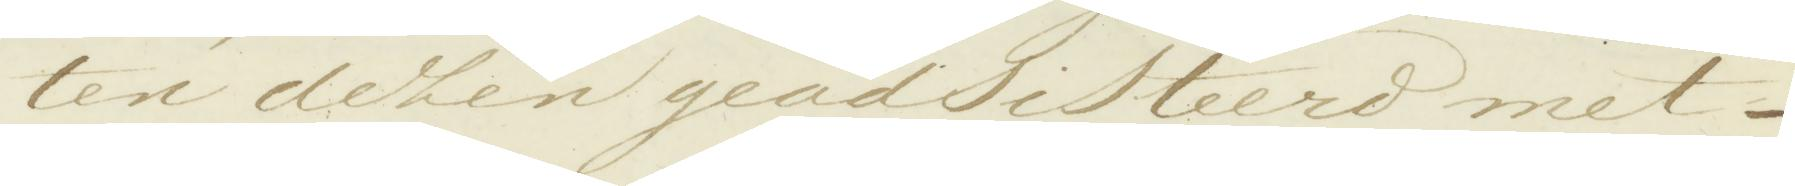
ten dezen geadsisteerd met-
